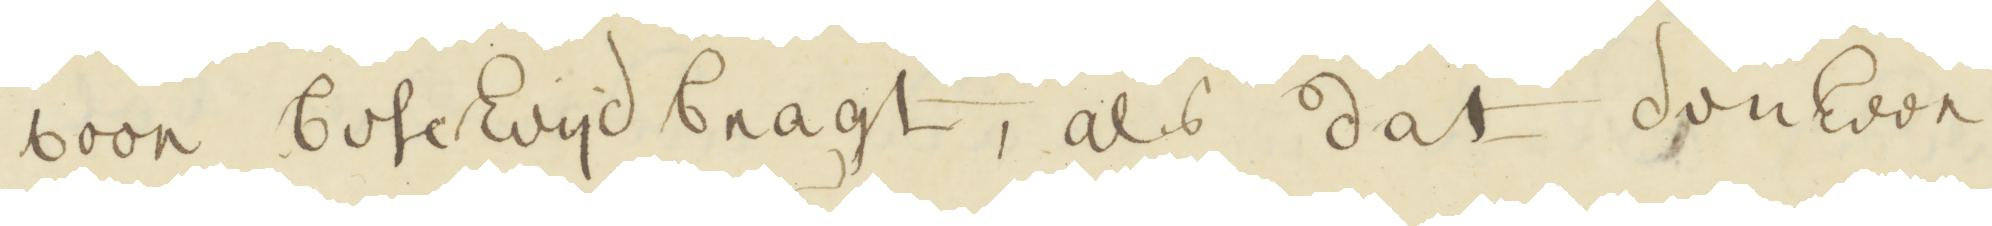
voor bescheijd bragt, als dat den heer
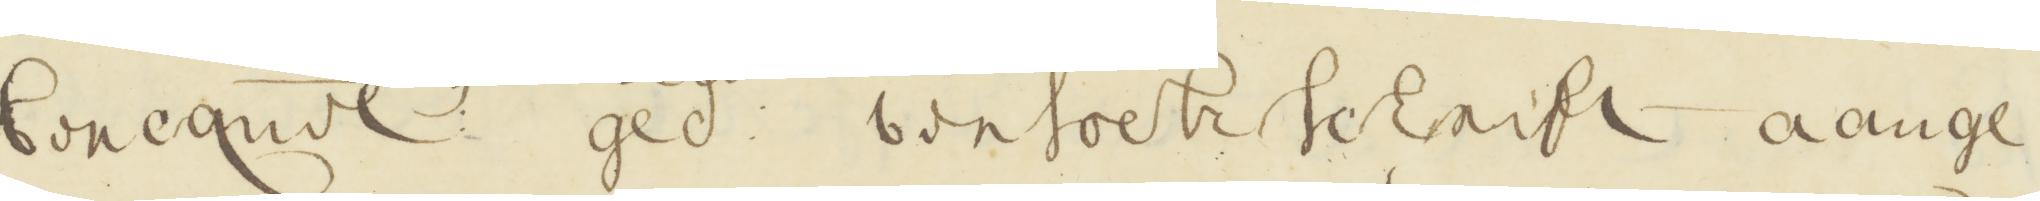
bercquel:g ged:ne versoekschrift aange
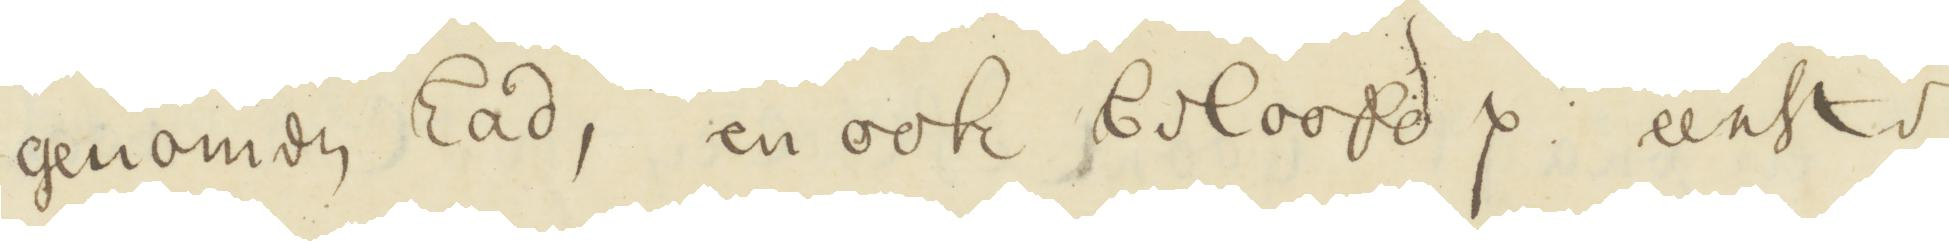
genomen had, en ook beloofd p:r eerste
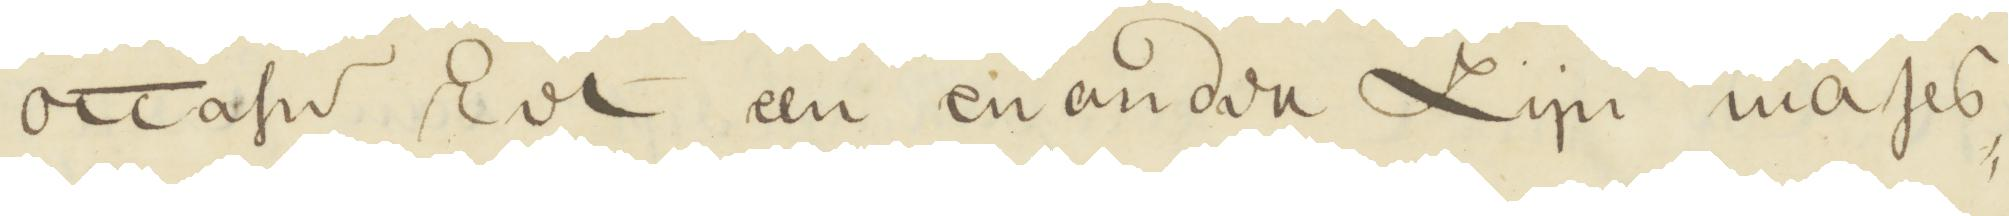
occasie het een en ander Zijn majes
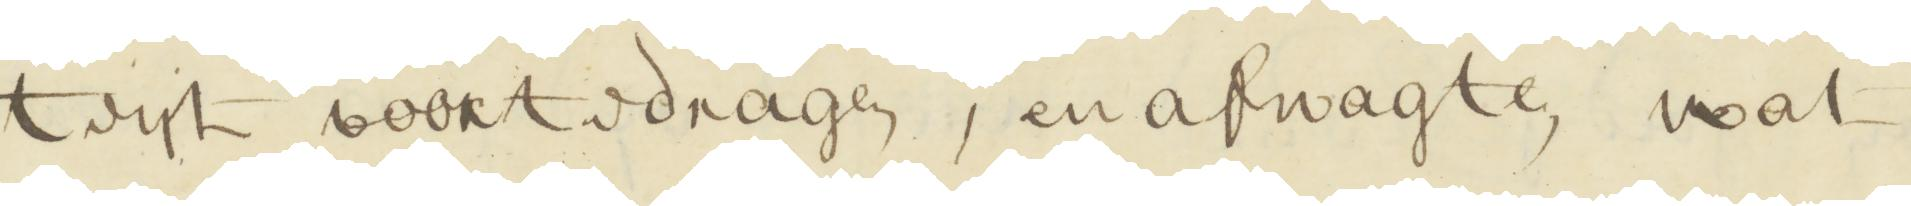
teijt voor te dragen, en afwagte, wat
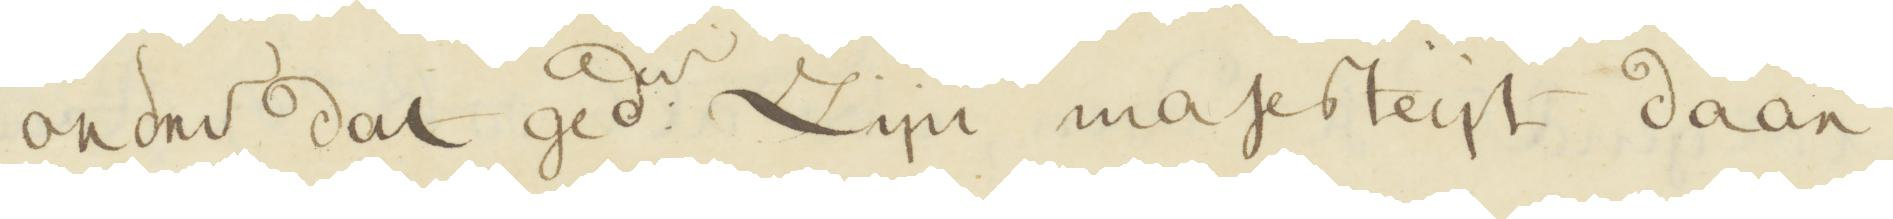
ordre dat ged:ne Zijn majesteijt daar
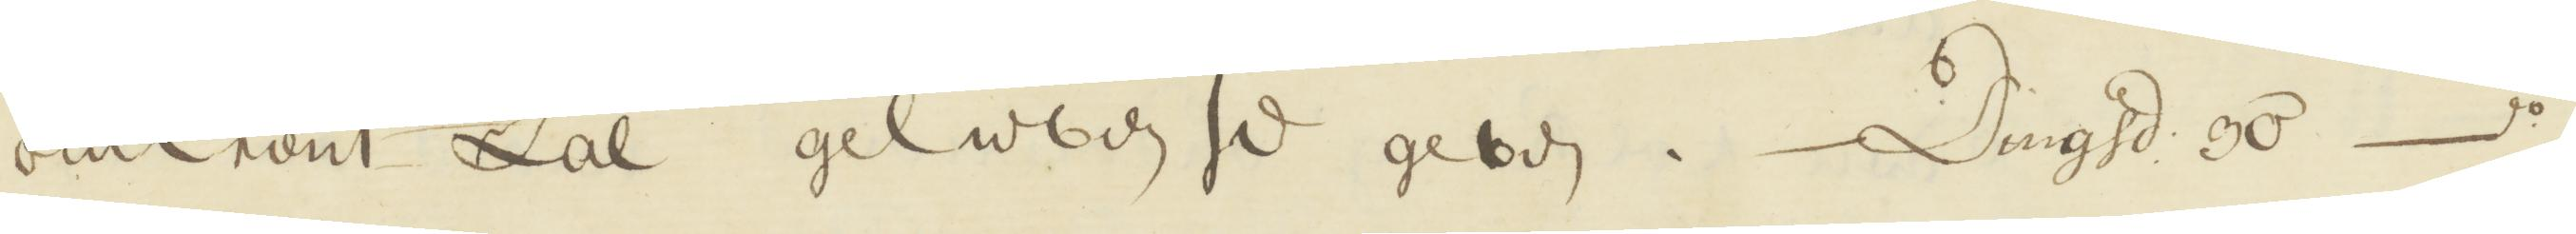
omtrent Zal gelieven te geven. Dingsd: 30 _„o
